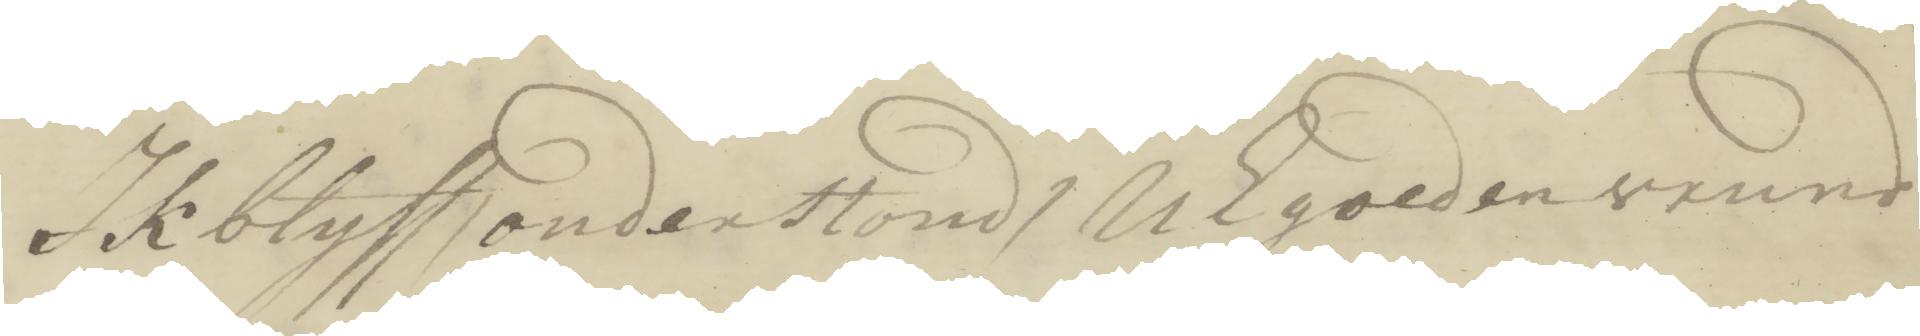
Ik blyff /onderstond/ uE goeden vrund
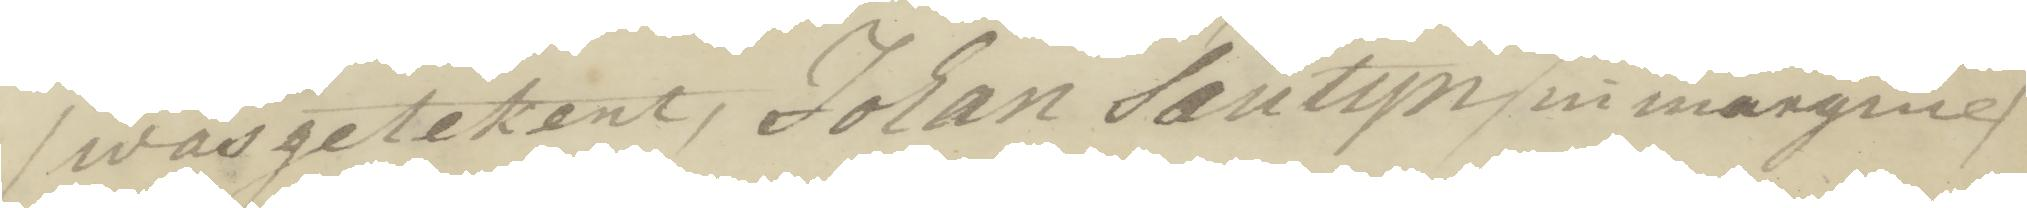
/was getekent/ Iohan sautyn /in margine/
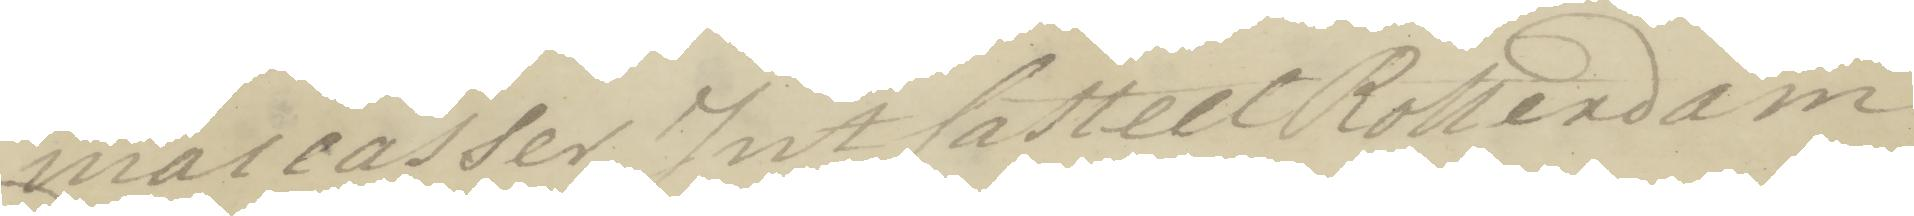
mascasser Jn't Casteel Rotterdam
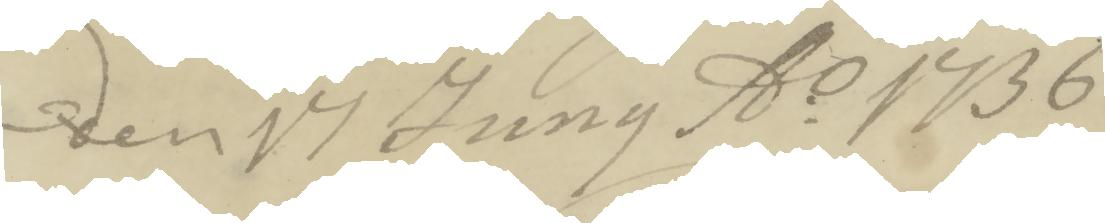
den 17 Iuny A:o 1736
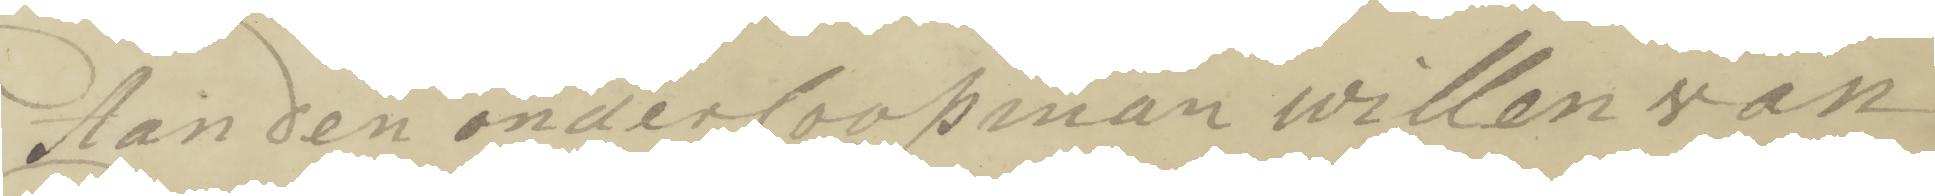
Aan den onder Coopman willen van
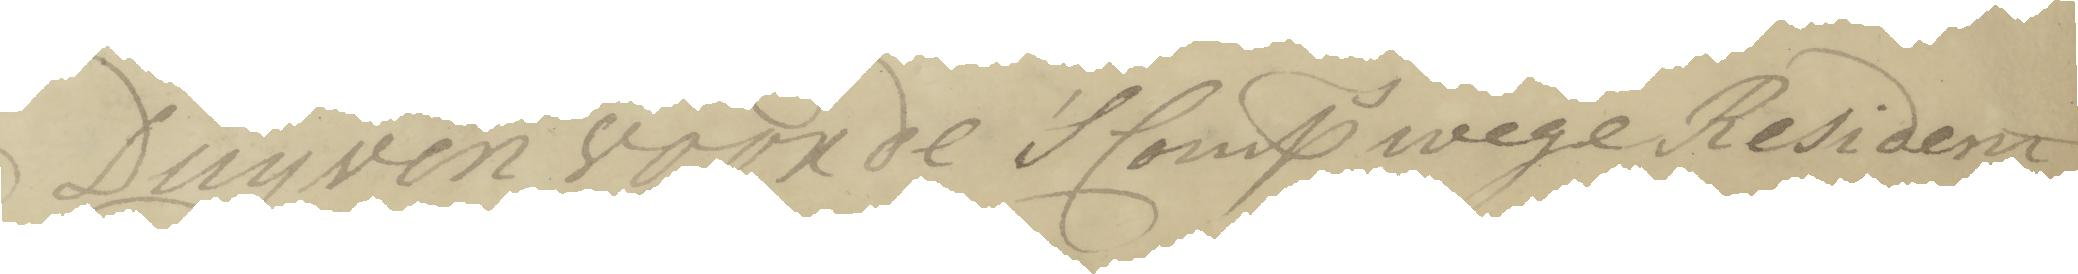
Duyven voorde ’s Comps wege Resident
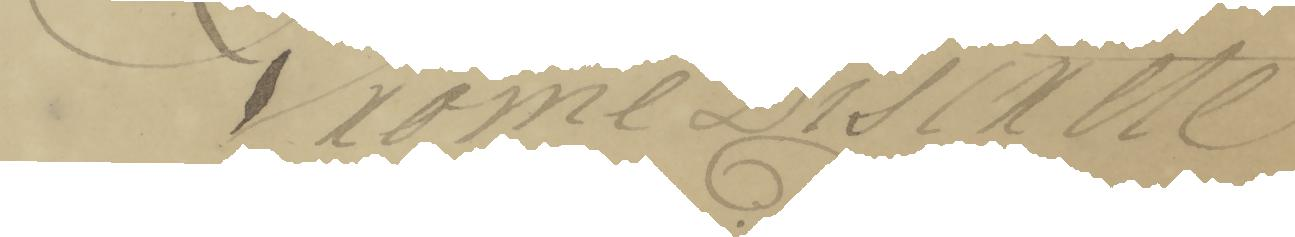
Vrome Discrete
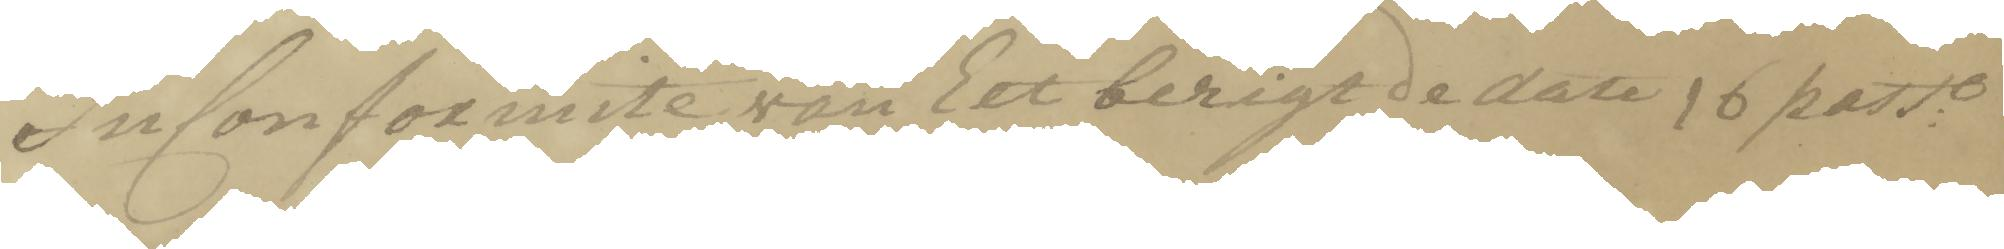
In Conformite van het berigt de dato 16 pass=o
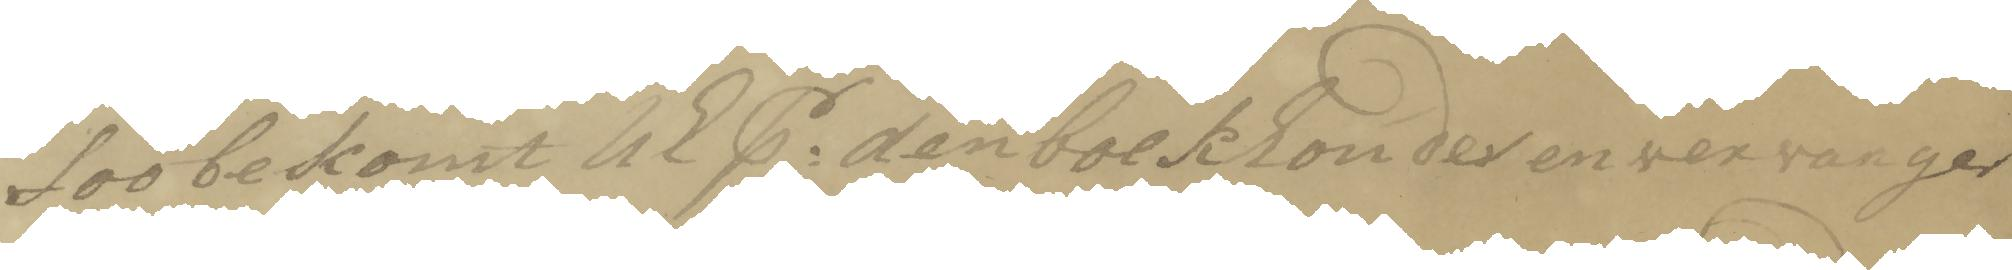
soo bekomt uE p:r den boekhouder en vervanger
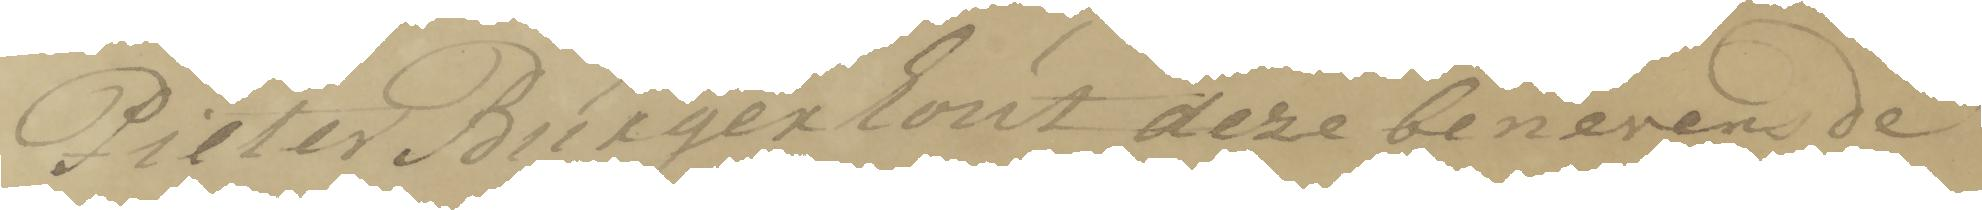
Pieter Burgerhout deze benevens de
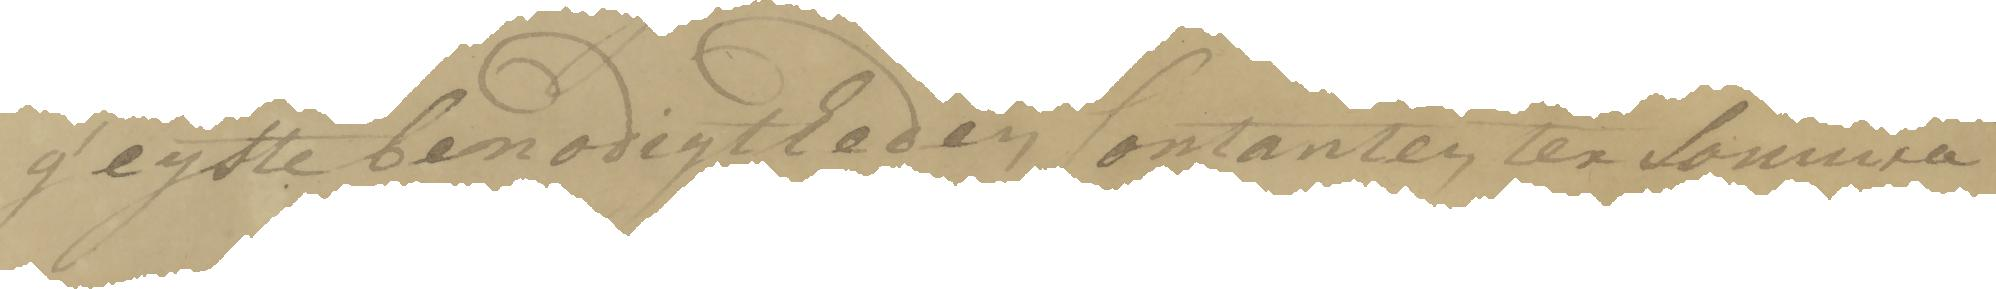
g’eyste benodigtheden Contanten ter somma
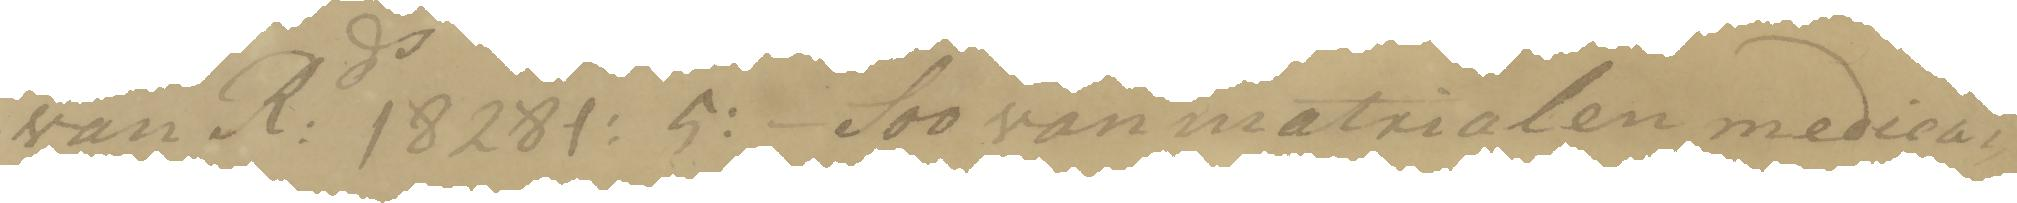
van R:ds 18281: 5: — soo van matrialen medica„
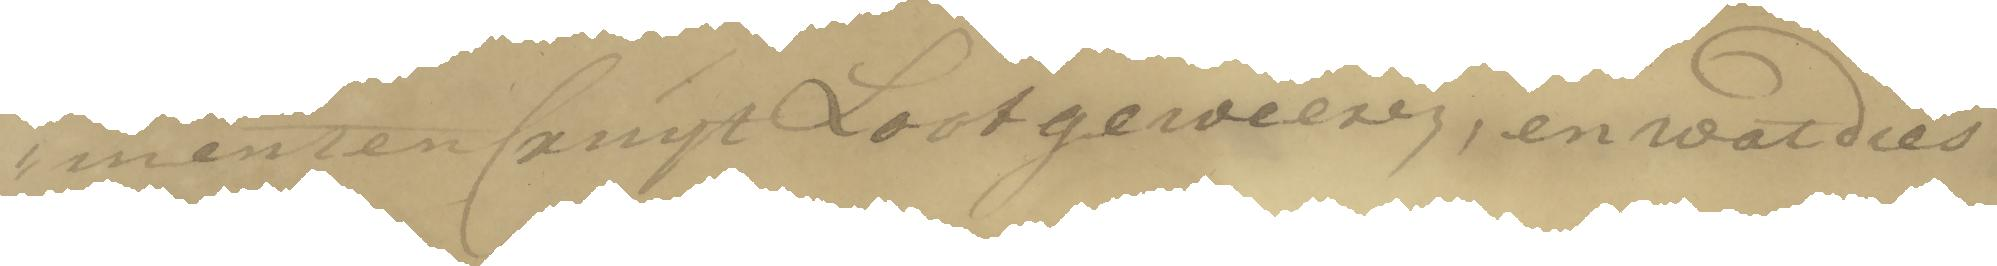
„menten Cruyt Lootgeweeren, en wat dies
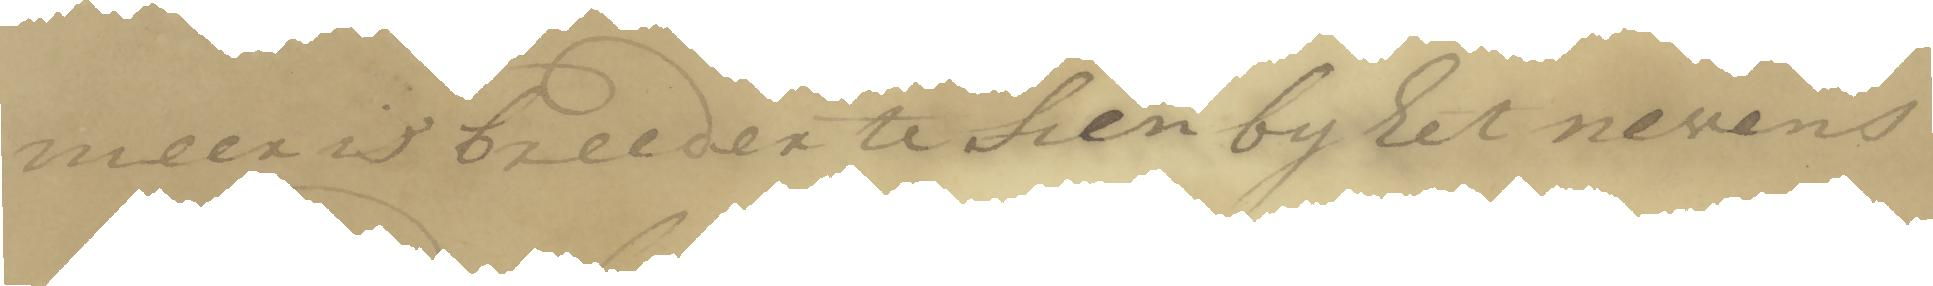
meer is breeder te sien by het nevens
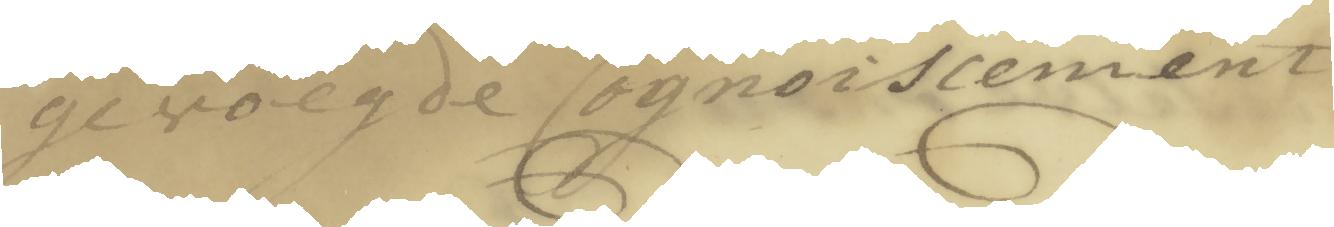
gevoegde Cognoiscement
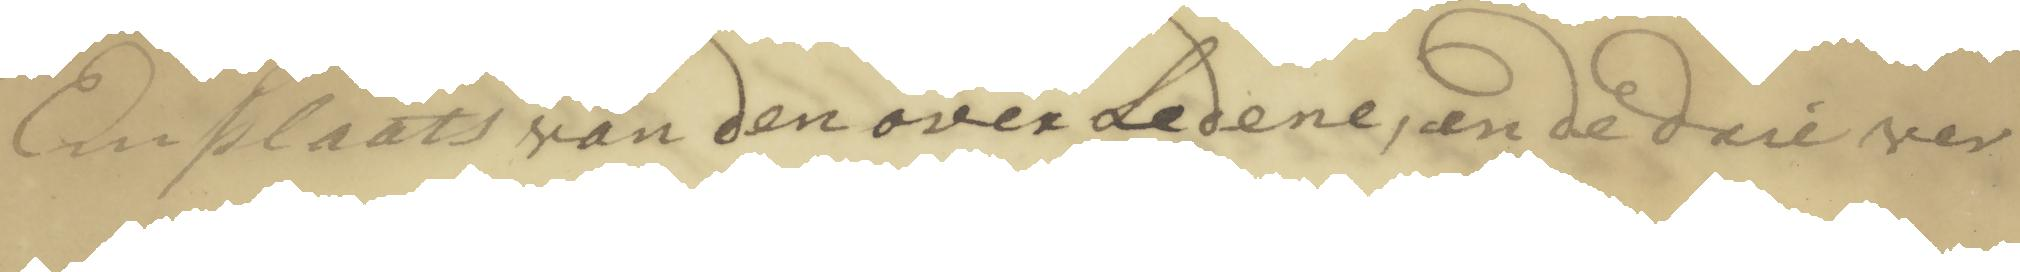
Een plaats van den over ledene, en de drie ver
